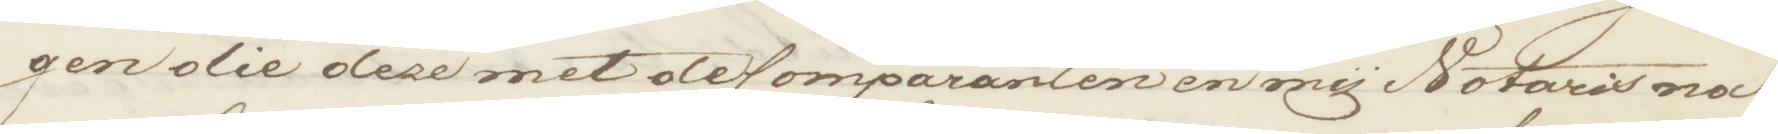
gen die deze met de Comparanten en mij Notaris no
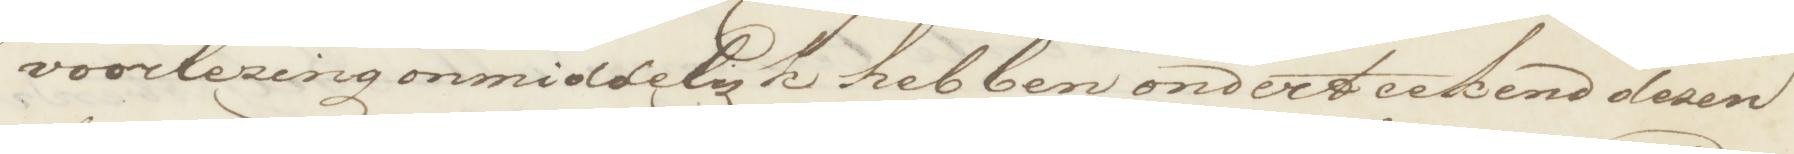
voorlezing onmiddelijk hebben onderteekend dezen
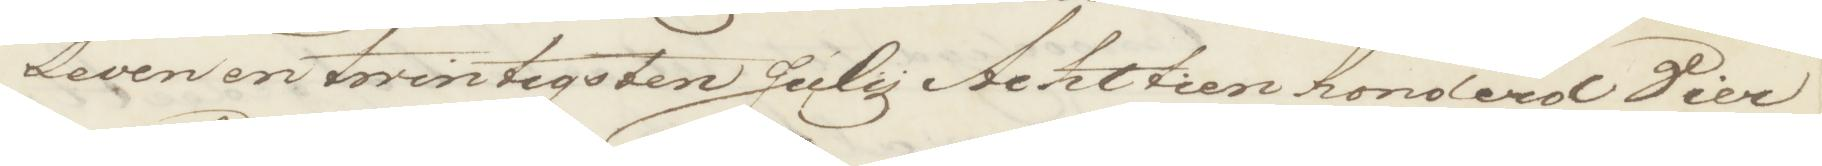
Zeven en twintigsten Julij Achttien honderd Vier
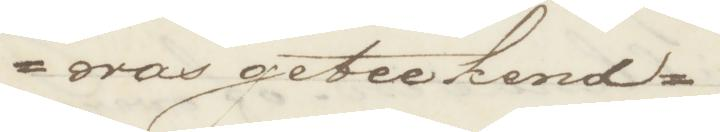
=was geteekend=
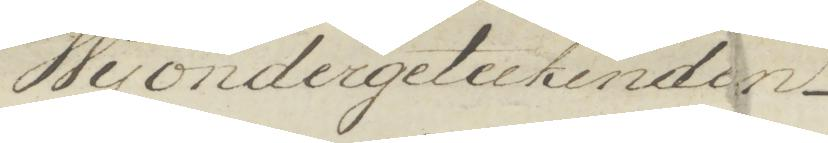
Wy ondergeteekenden-
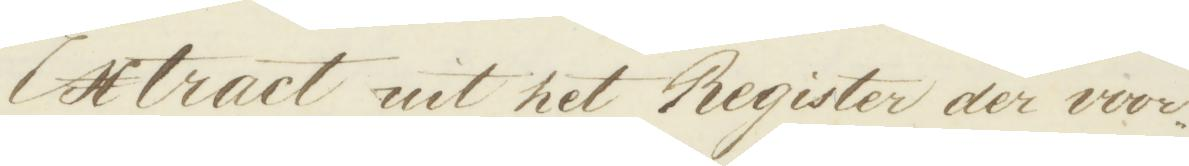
Extract uit het Register der voor„
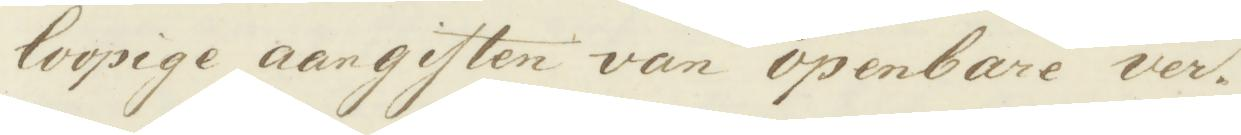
loopige aangiften van openbare ver„
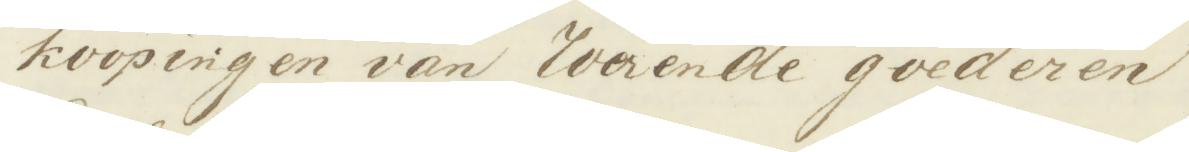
kooping en van roerende goederen
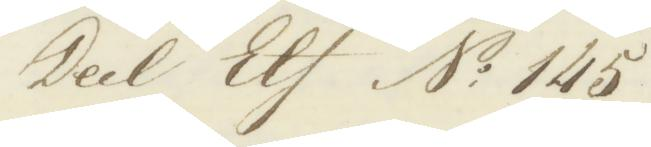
Deel Elf N:o 145
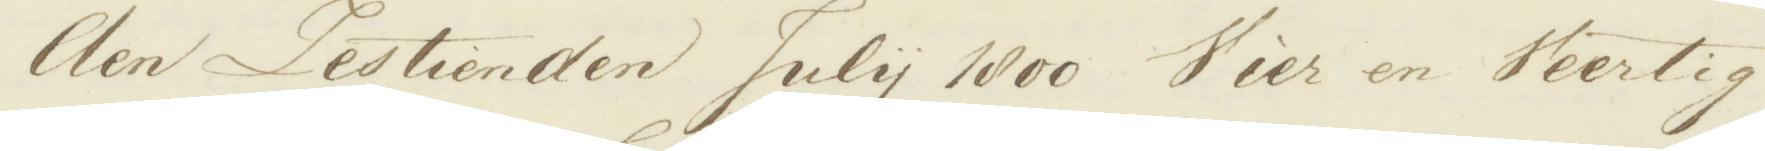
Den Zestienden Julij 1800 Vier en Veertig
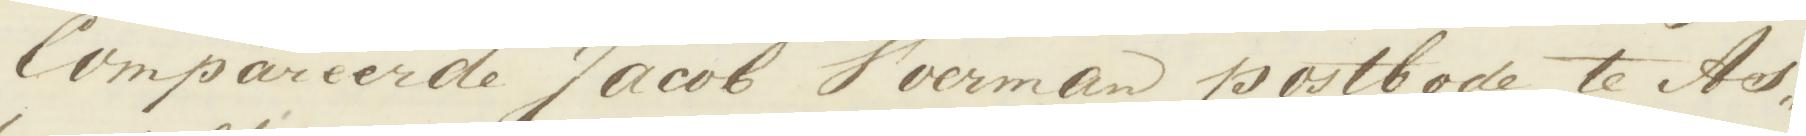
Compareerde Jacob Voerman postbode te As„
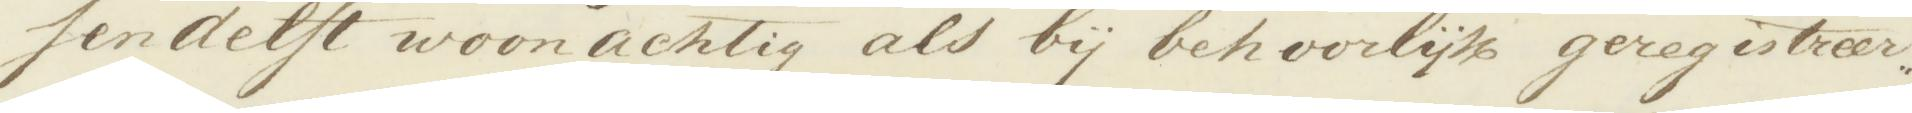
sendelft woonachtig als bij behoorlijk geregistreer„
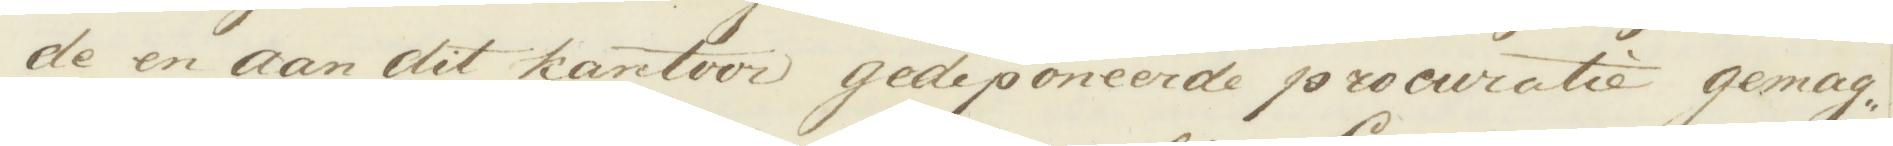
de en aan dit kantoor gedeponeerde procuratie gemag„
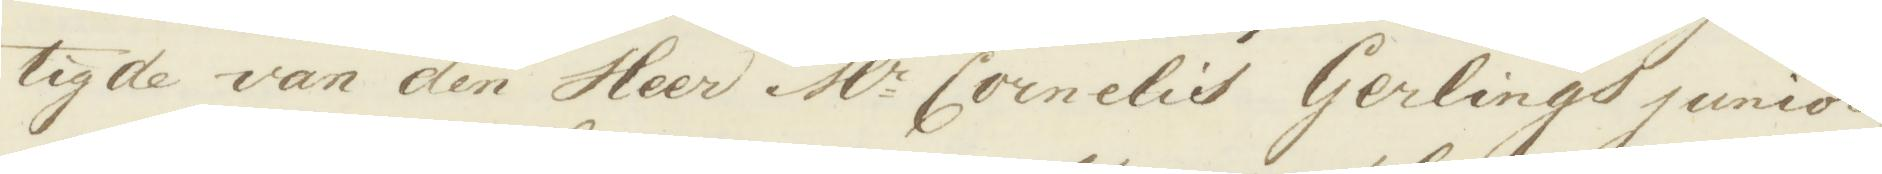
tigde van den Heer M=r Cornelis Gerlings junior
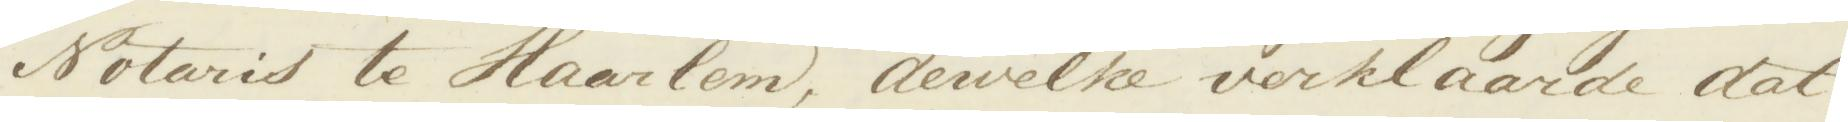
Notaris te Haarlem, dewelke verklaarde dat
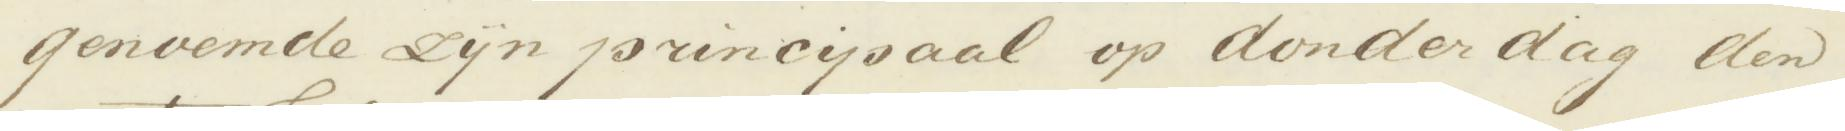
genoemde zijn principaal op donder dag den
